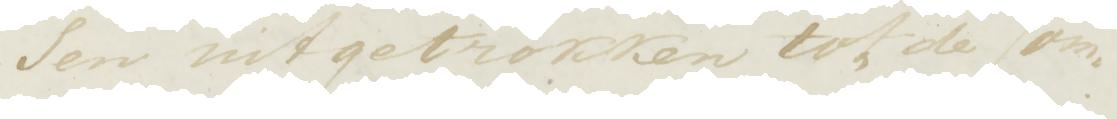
sen uitgetrokken tot de som„
